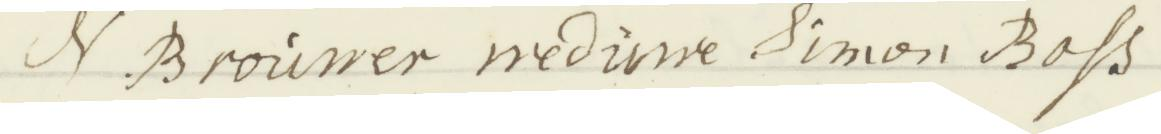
N Brouwer weduwe Simon Boss
